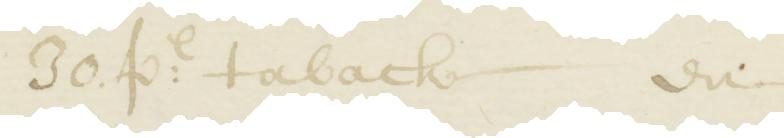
30. p:l taback en
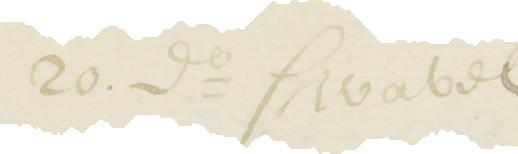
20. _=o swavel
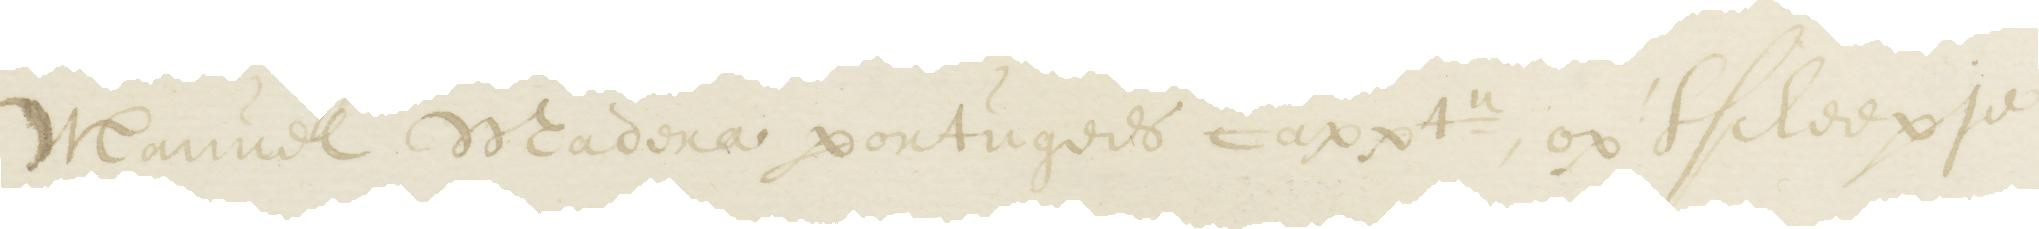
Manuel Madera portugees cappt=n, op ’tscheepje
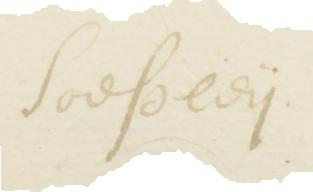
toessleij.
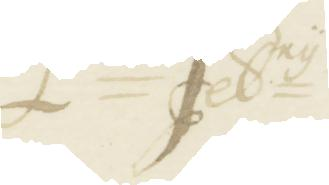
P=mo Feb=rij
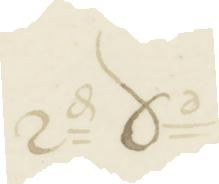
2=en d=o
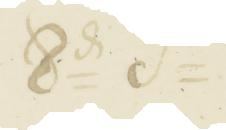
8=en d=o
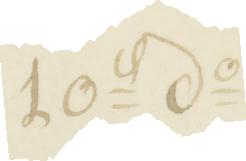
10=en d=o
